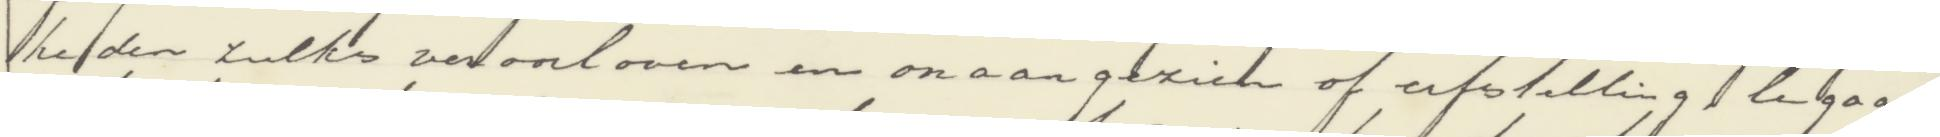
heden zulks veroorloven en onaangezien of erfstelling legaat
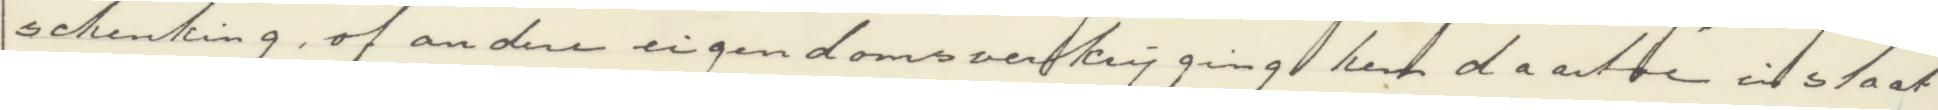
schenking, of andere eigendoms verkrijging hen daartoe in staat
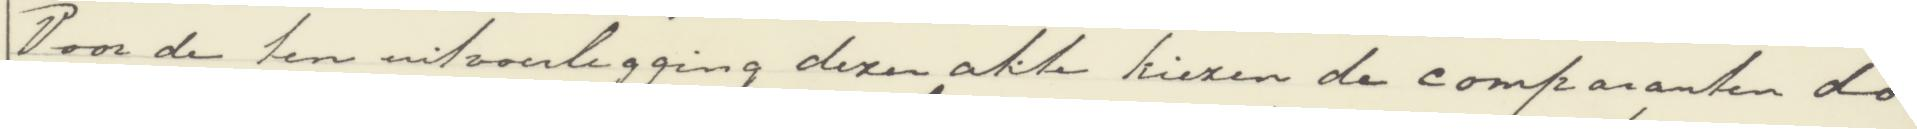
Voor de ten uitvoerlegging dezer akte kiezen de comparanten do.
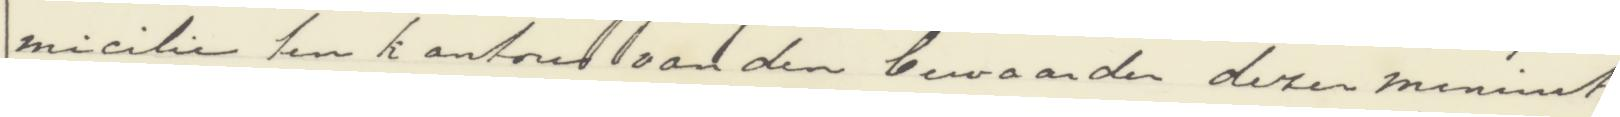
micilie ten kantore van den bewaarder dezer minuut
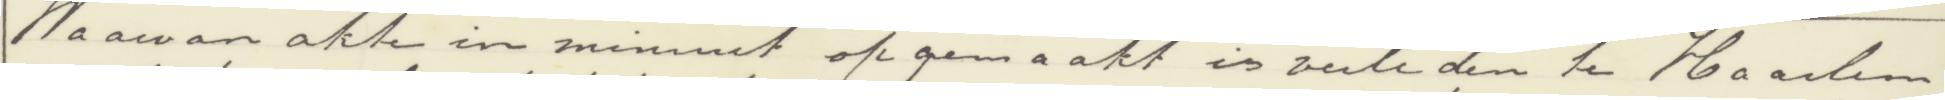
Waarvan akte in minuut opgemaakt is verleden te Haarlem
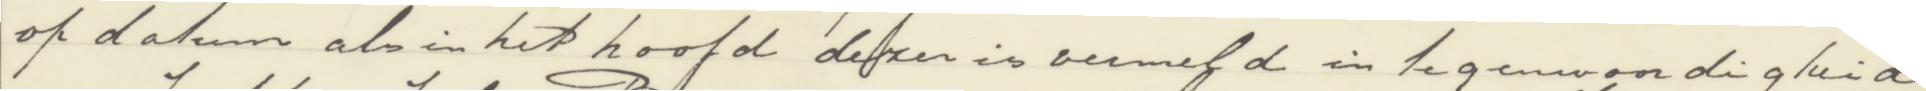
op datum als in het hoofd dezer is vermeld in tegenwoordigheid
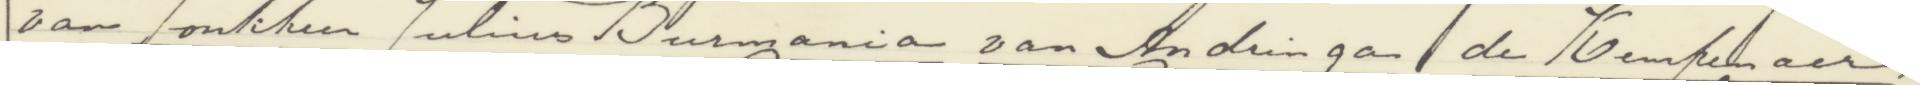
van Jonkheer Julius Burmania van Adnringa de Kempenaer,
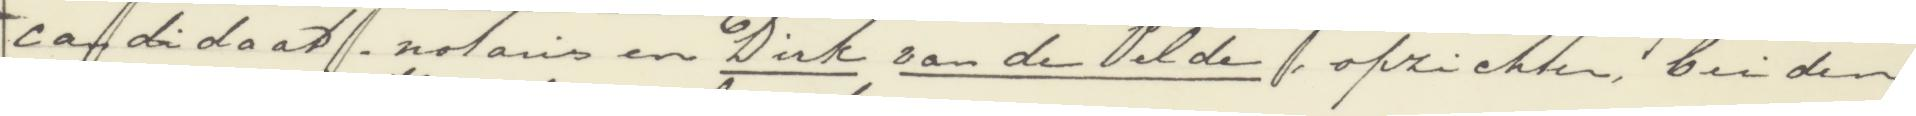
candidaat - notaris en Dirk van de Velde, opzichter, beiden
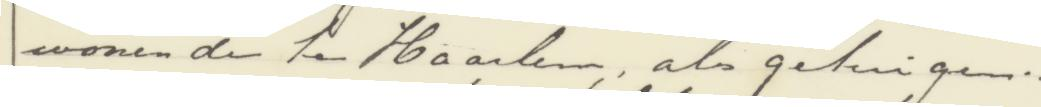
wonende te Haarlem, als getuigen.
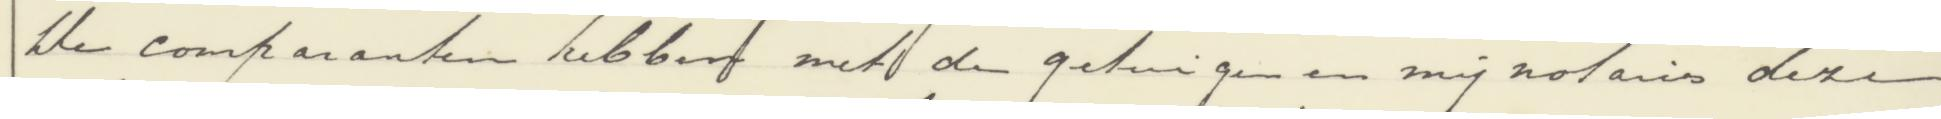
De comparanten hebben met de getuigen en mij notaris deze
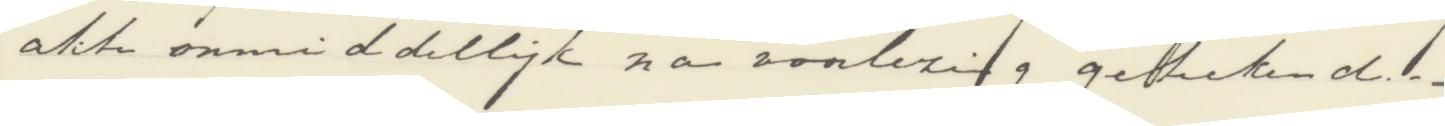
akte onmiddellijk na vorlezing geteekend. -
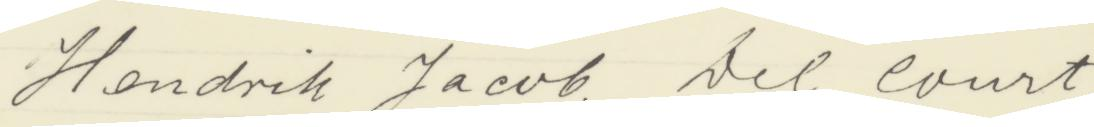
Hendrik Jacob. Del Court
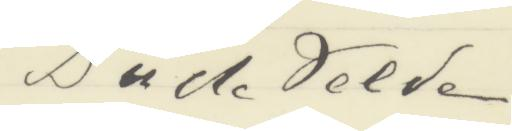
D v de Velde
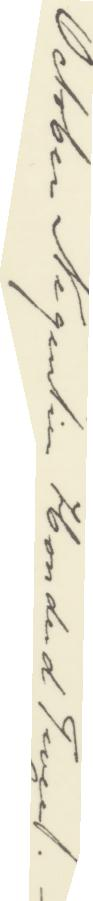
October Negentien Honderd Twee.
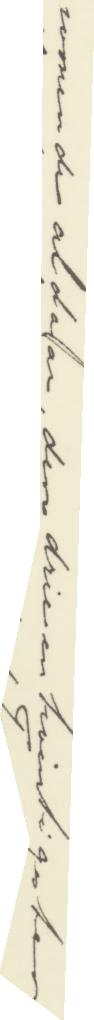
wonende aldaar, den drie en twintigsten
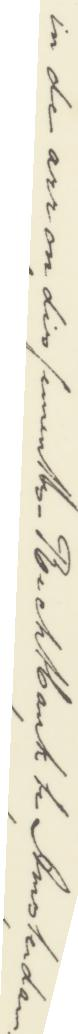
in de arrondissements-Rechtbank te Amsterdam
